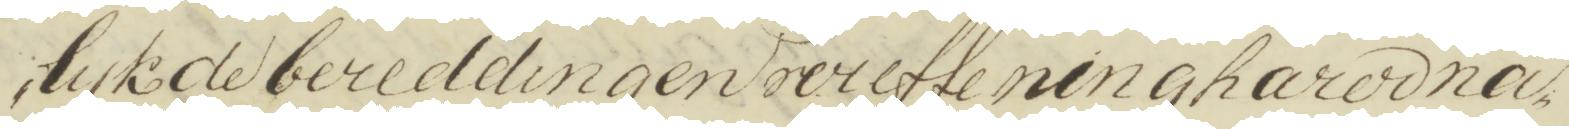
„lyk de beredding en vereffening harer na„
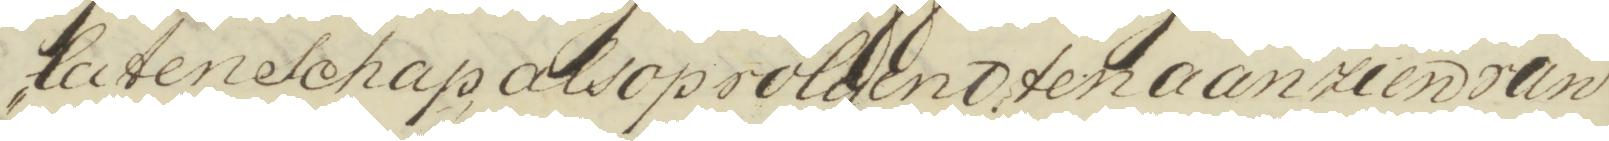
„latenschap als opvolgend ten aanzien van
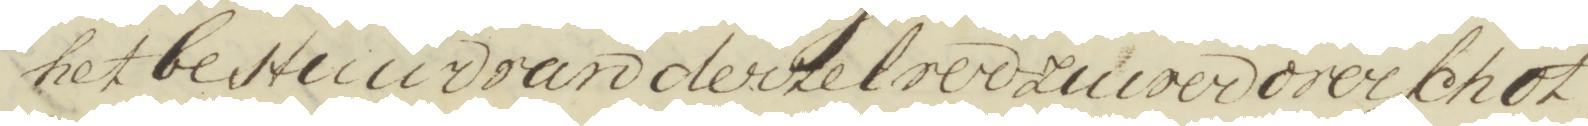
het bestuur van derzelver zuiver overschot
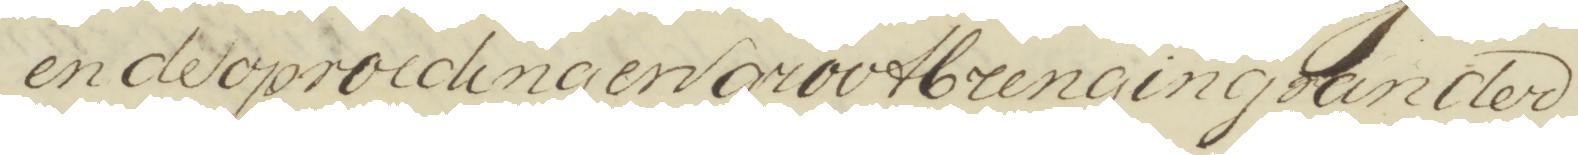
en de opvoeding en grootbrenging van der
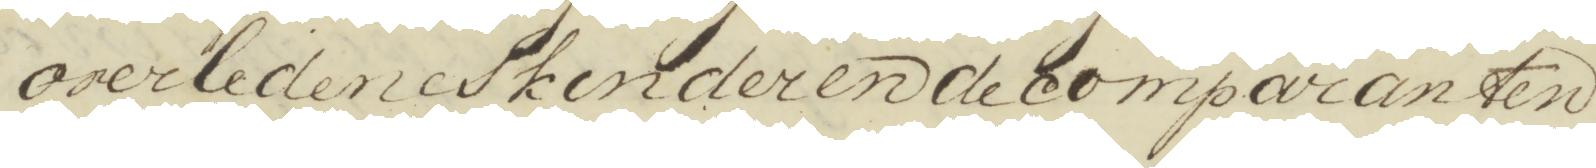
overledenes kinderen de Comparanten
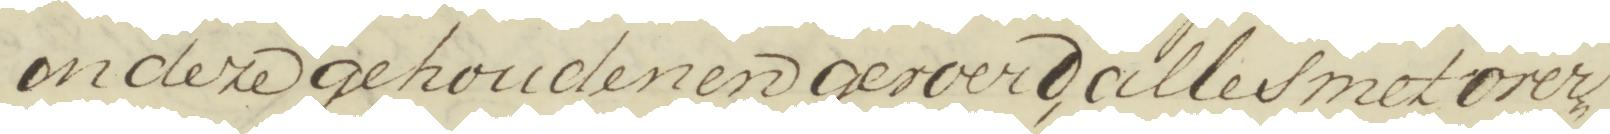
in deze gehouden en gevoerd, alles met over„
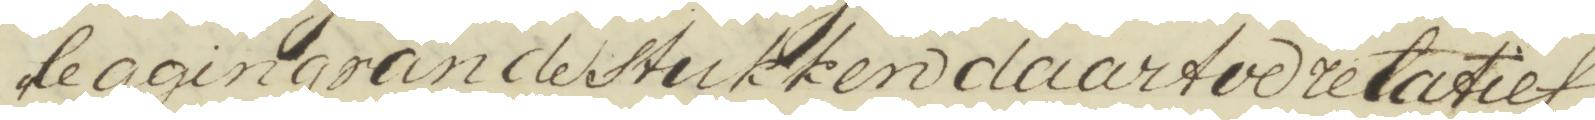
„legging van de stukken daartoe relatief
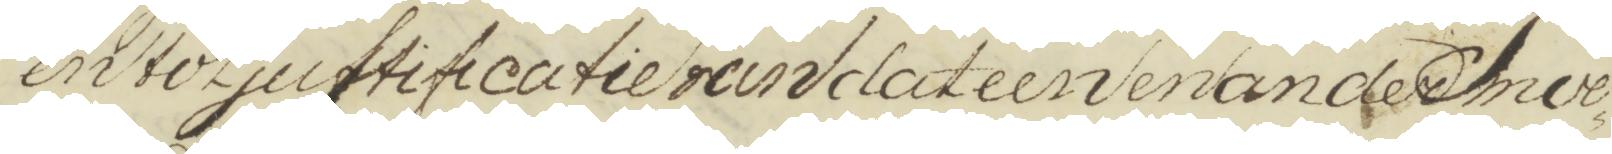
en tot justificatie van dat een en ander moe„
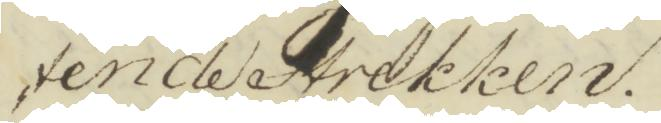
„tende strekken.
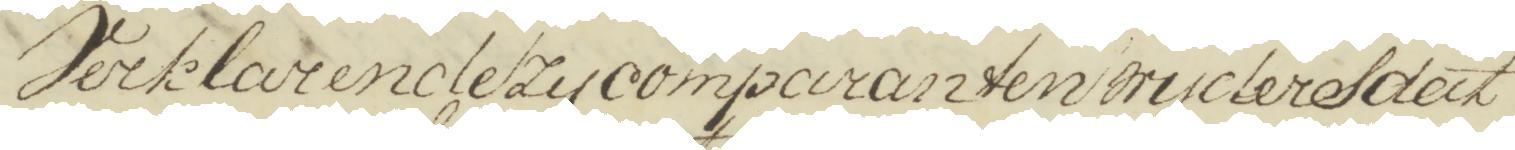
Verklarende zy comparanten wyders dat
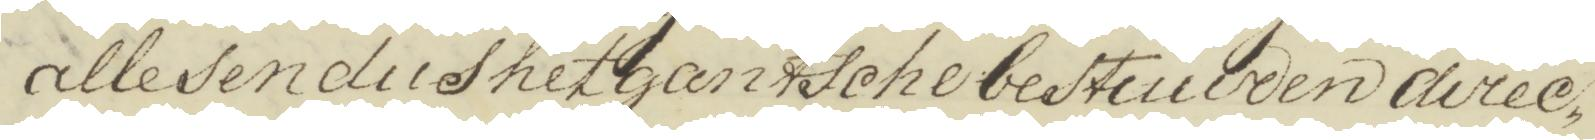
alles en dus het gantsche bestuur en direc„
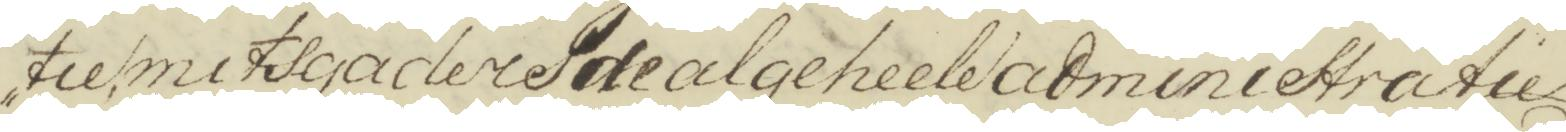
„tie mitsgaders de algeheele administratie
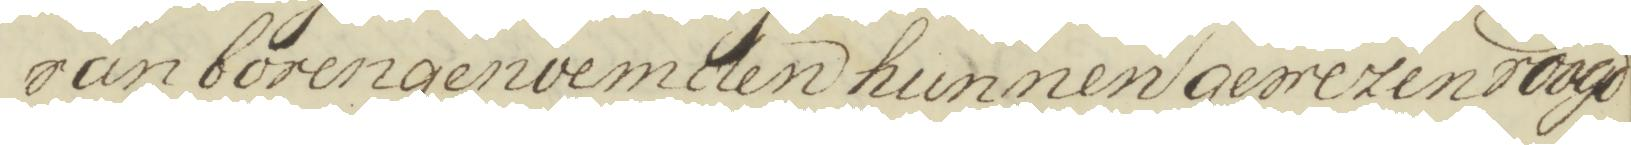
van bovengenoemden hunnen gewezen voogd
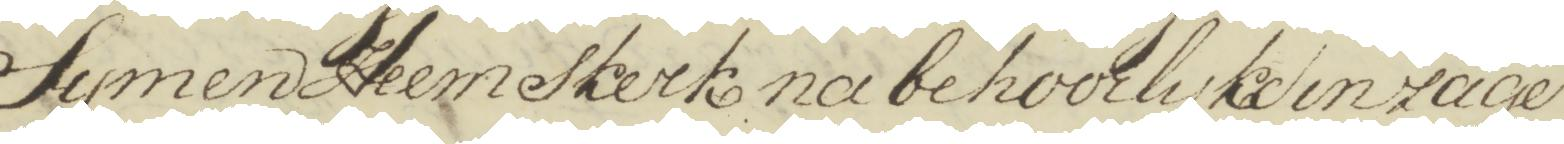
Symen Heemskerk na behoorlyke inzage
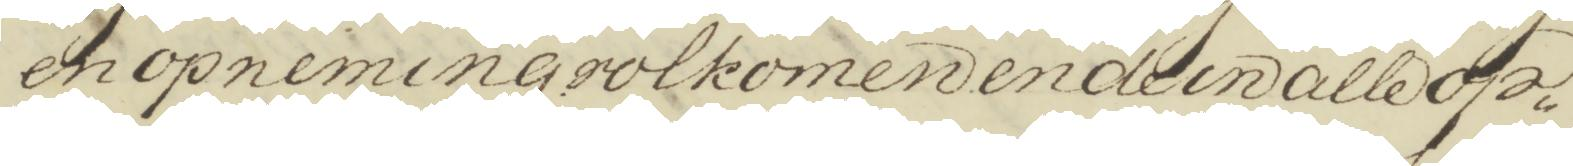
en opneming volkomen ende in alle op„
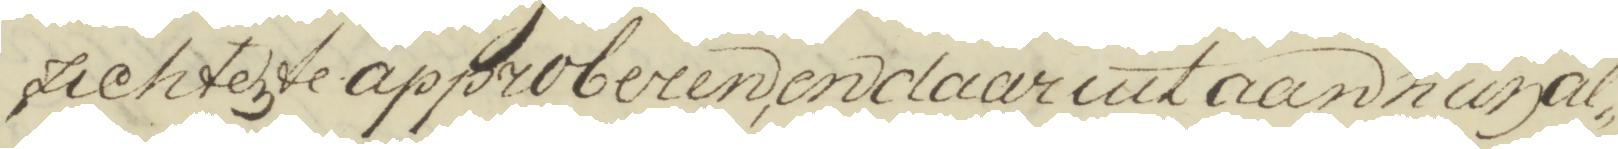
zichten te approberen en daar uit aan hun al„
